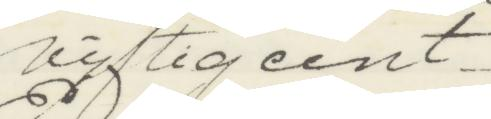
vijftig cent
